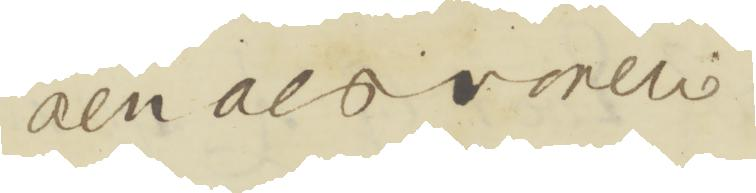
aen alsvoren
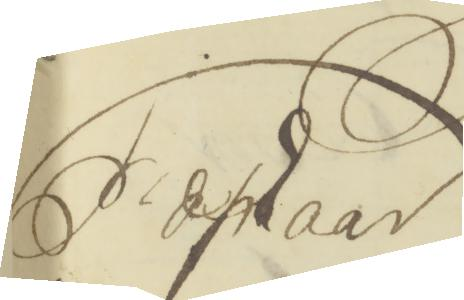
Pr dephaar
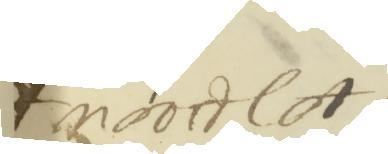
t noodlot
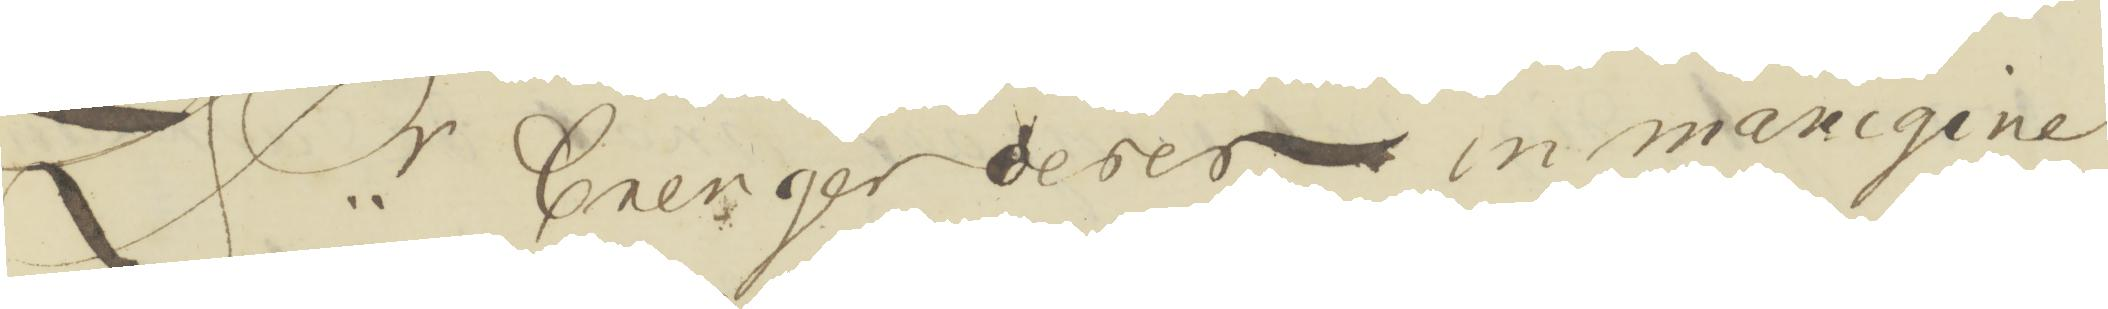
P„r brenger deser in margine
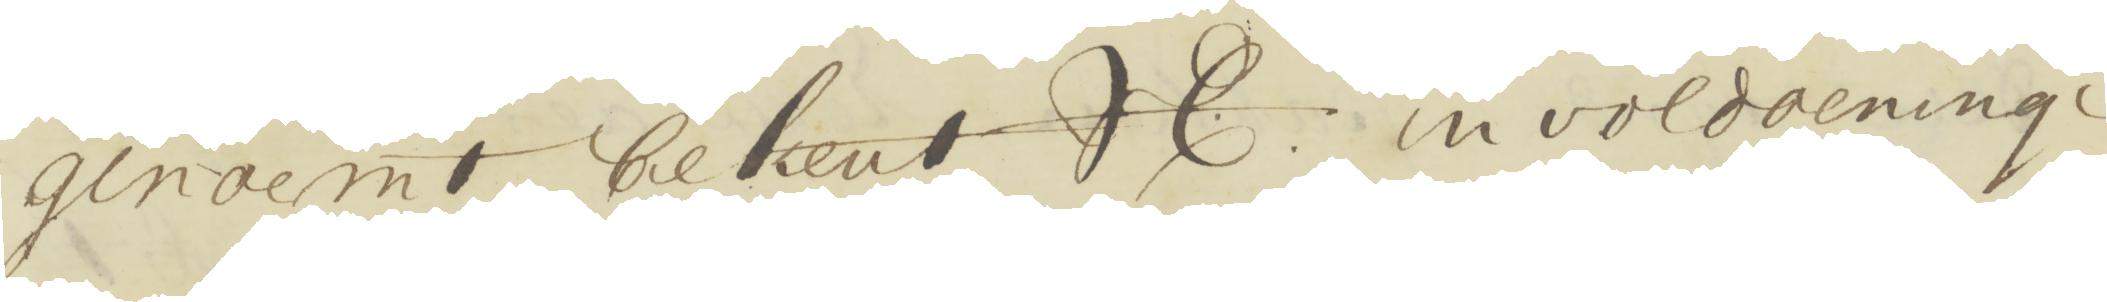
genoemt bekent VE: in voldoening
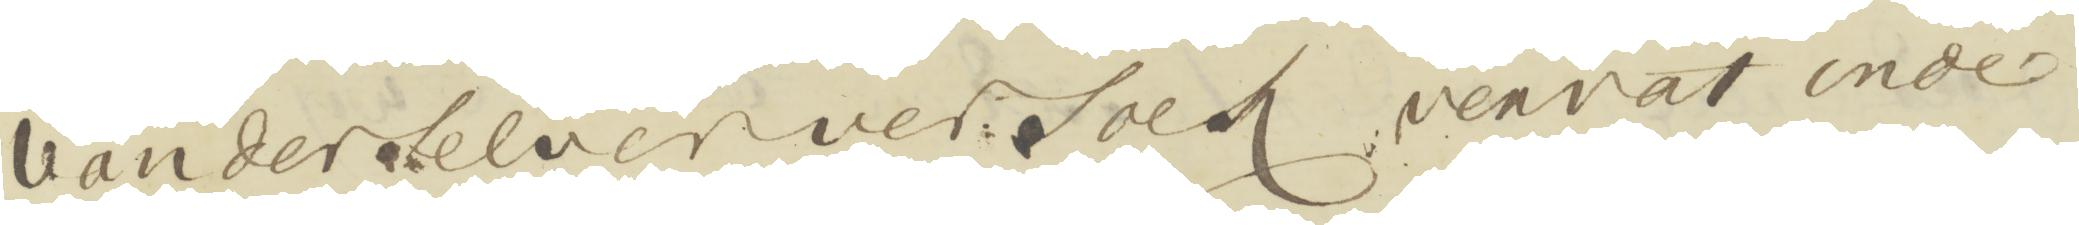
van derselven versoek vervat inde
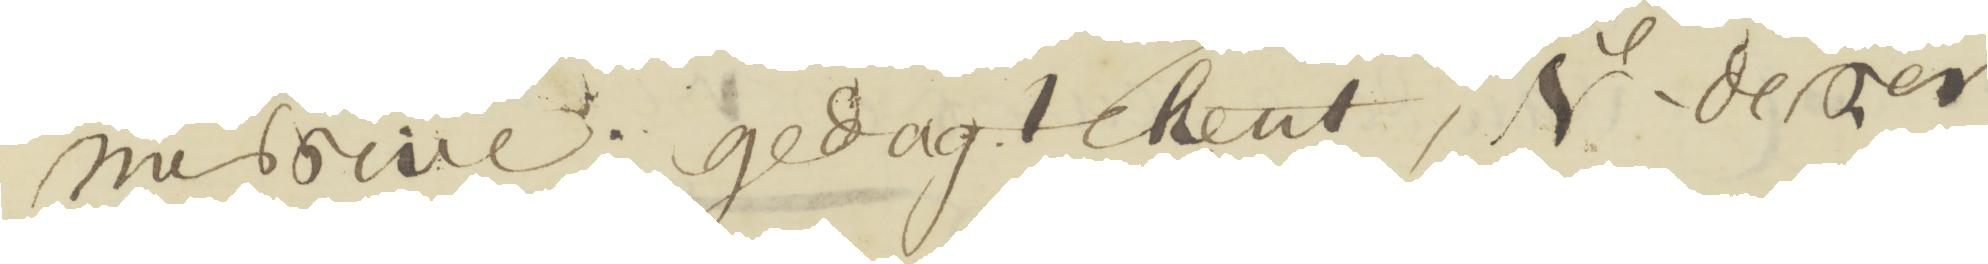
missive gedagtekent, 1e deser
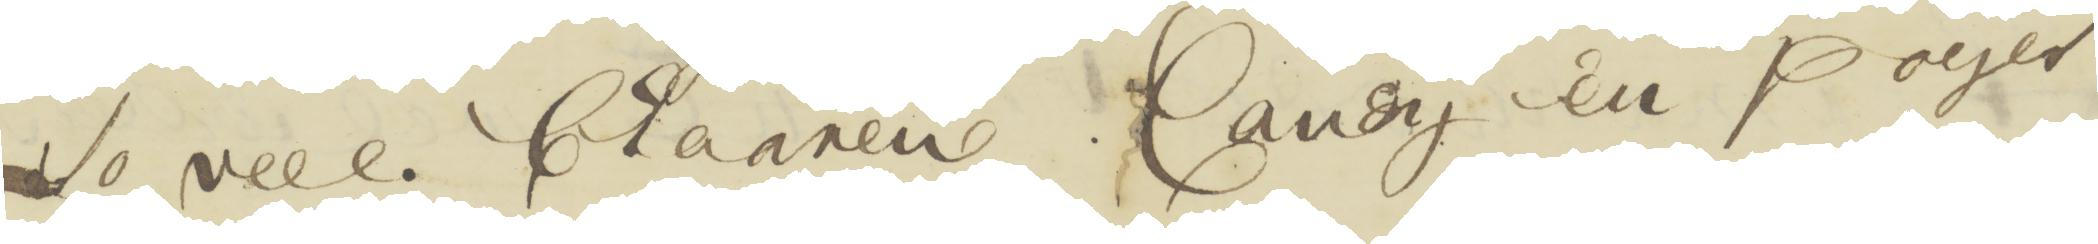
so veel bhaaren Candy en Poejer
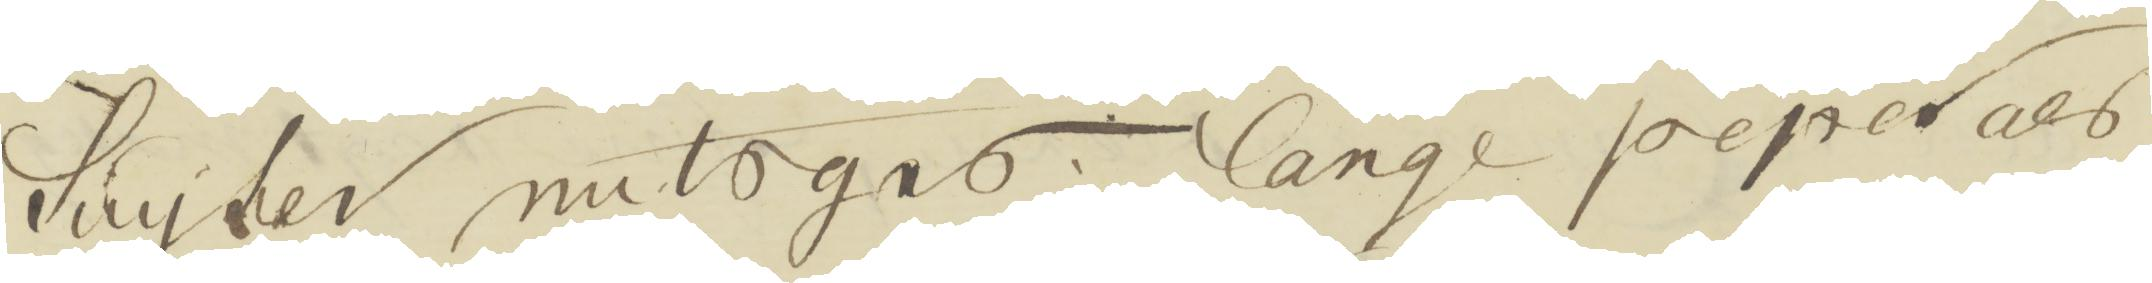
Suijker mitsgrs: lange peper als
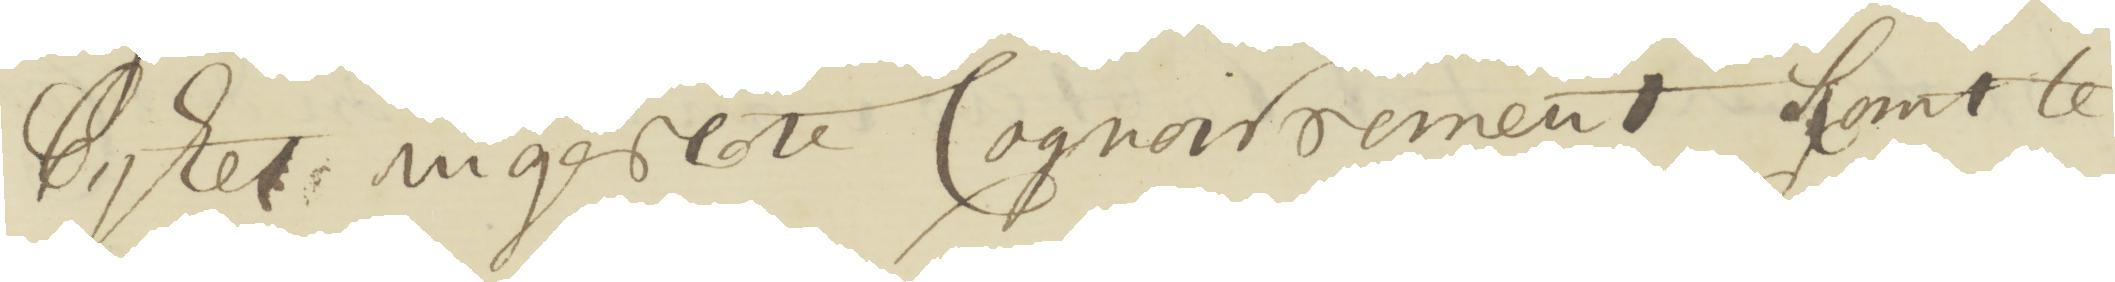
by het: ingeslote Cognoissement komt te
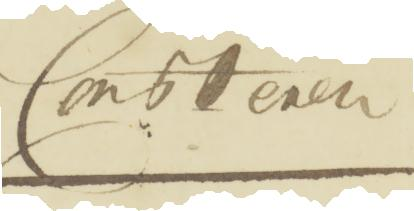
Corsteren
